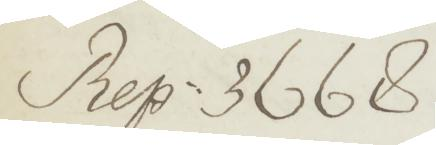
Rep: 3668
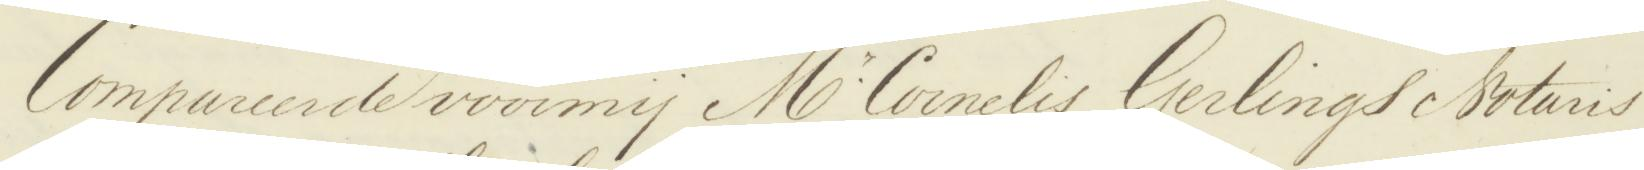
Compareerde voor mij M.r Cornelis Gerlings Notaris
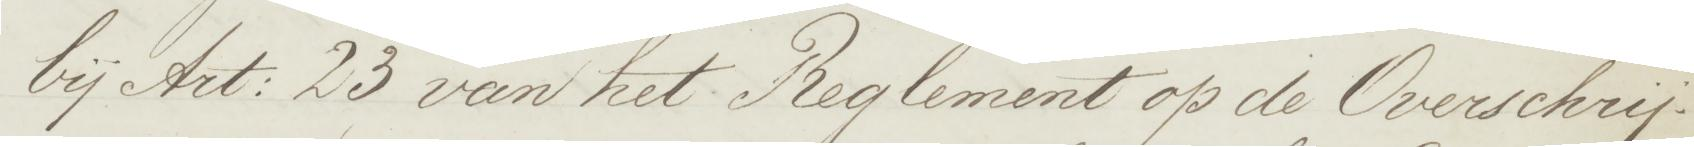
bij Art: 23 van het Reglement op de Overschrij„
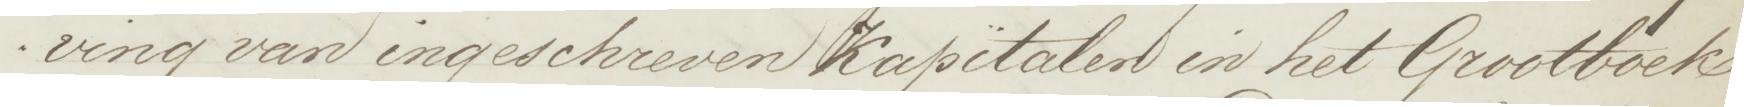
„ving van ingeschreven Kapitalen in het Grootboek
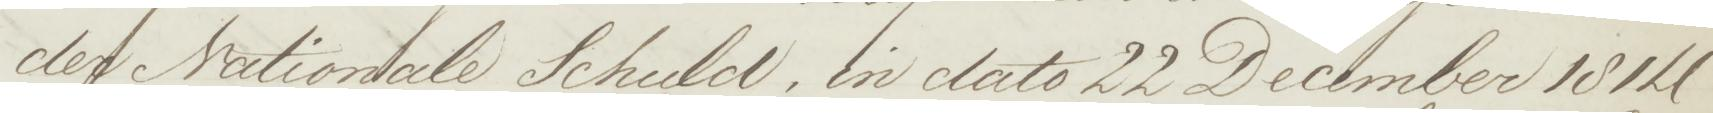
der Nationale Schuld, in dato 22 December 1814
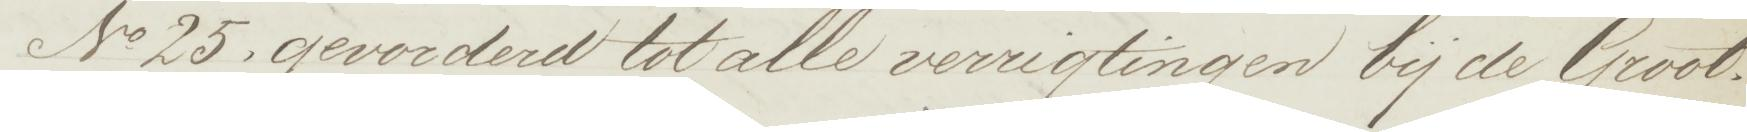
N=o 25, gevorderd tot alle verrigtingen bij de Groot„
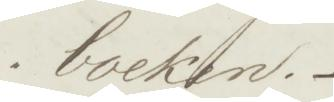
„boeken.
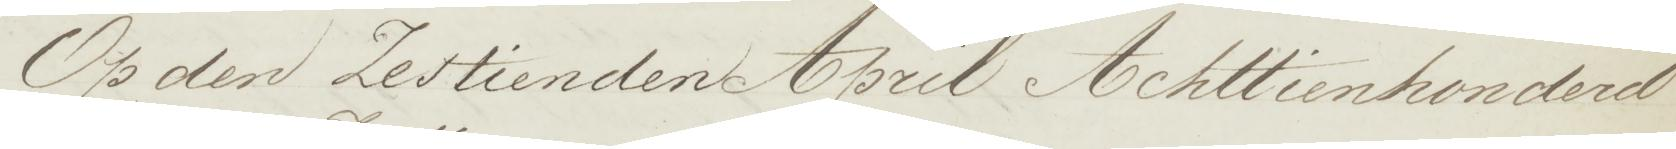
Op den Zestienden April Achttienhonderd
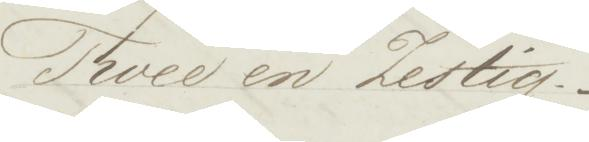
Twee en Zestig.
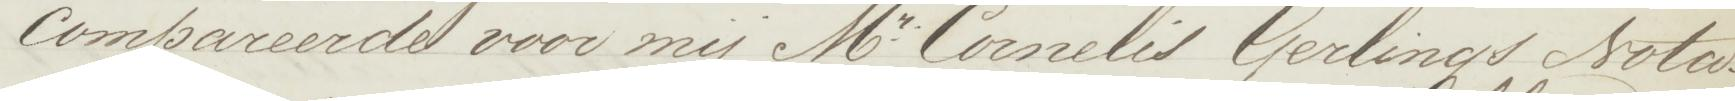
Compareerde voor mij M.r Cornelis Gerlings Nota
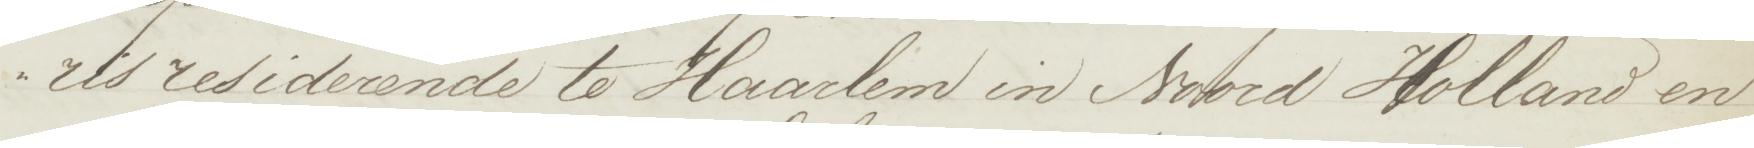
„ris residerende te Haarlem in Noord Holland en
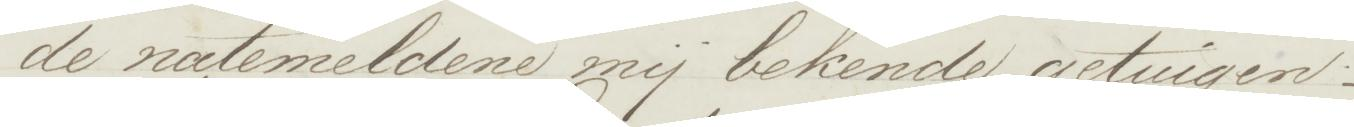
de natemeldene mij bekende getuigen:
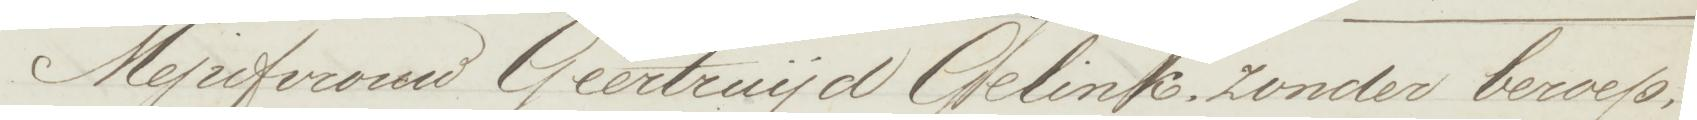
Mejufvrouw Geertruijd Gelink, zonder beroep,
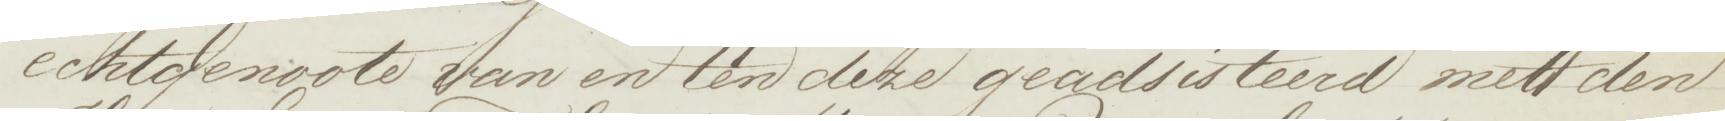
echtgenoote van en ten deze geadsisteerd met den
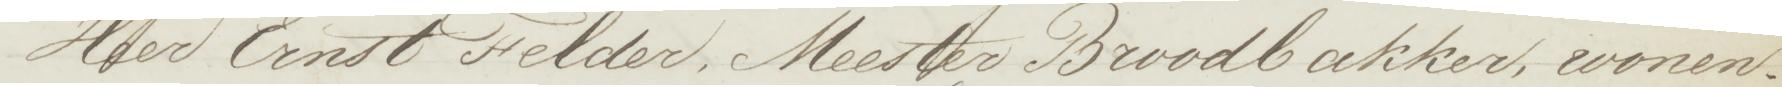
Heer Ernst Felder, Meester Broodbakker, wonen„
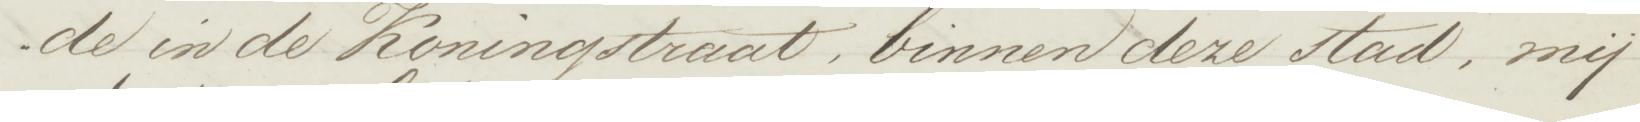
„de in de Koningstraat, binnen deze stad, mij
